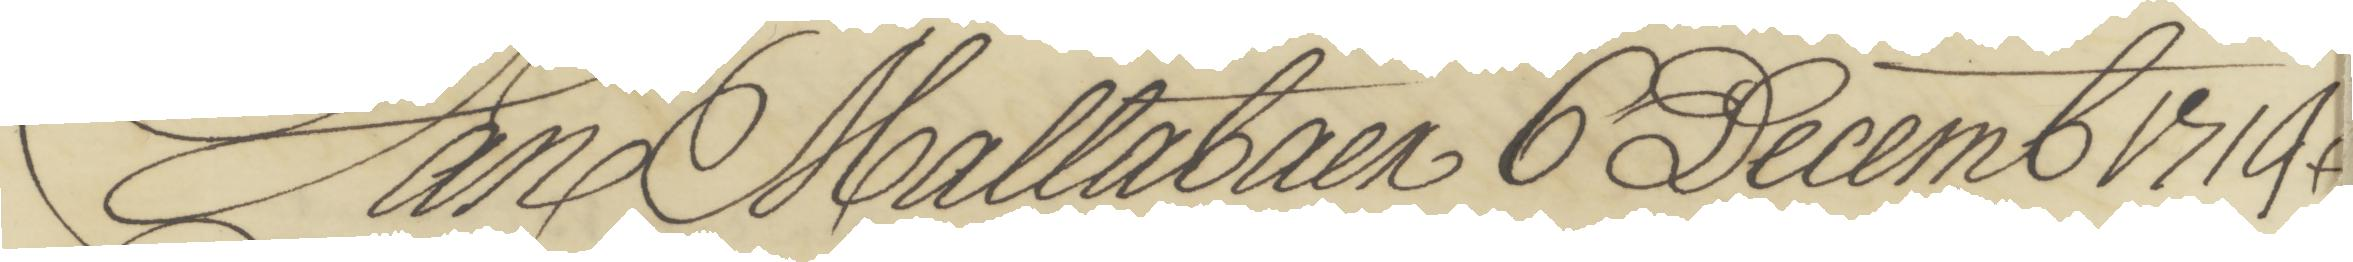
Van Mallabaer 6 Decemb 1714
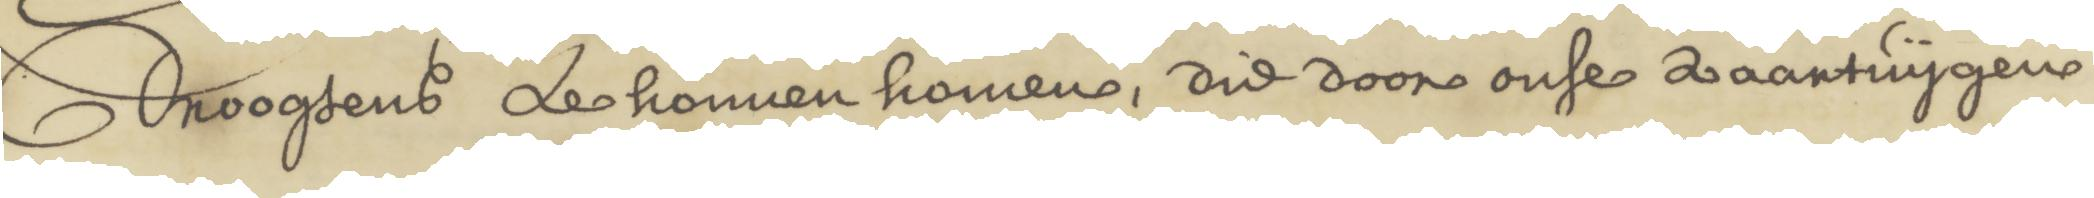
droogtens te konnen komen, die door onse vaartuijgen
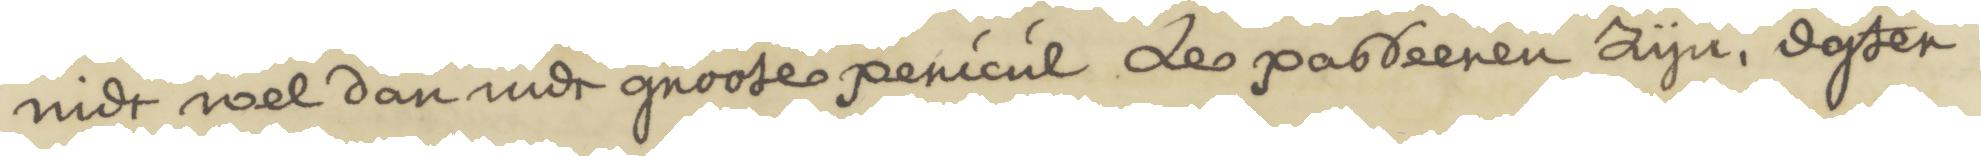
niet wel dan met groote pericul te passeeren zijn, egter
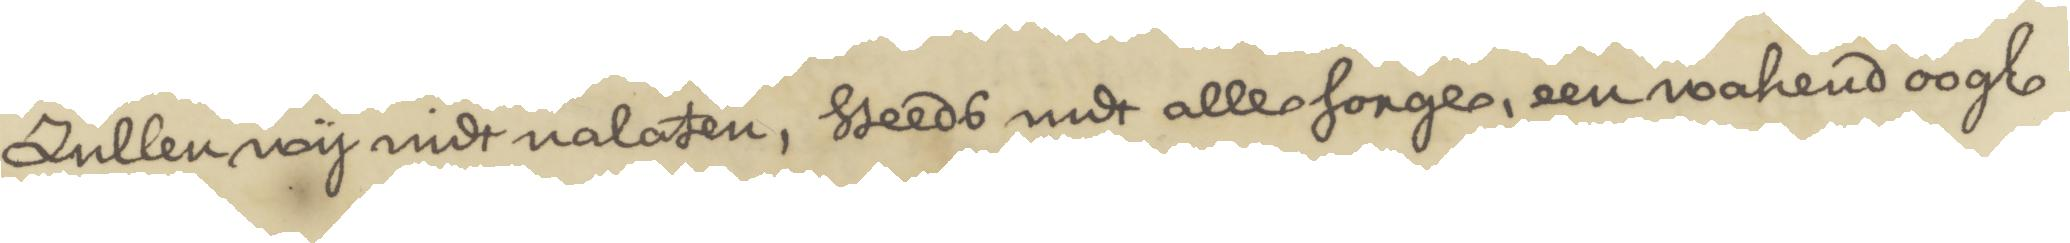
zullen wij niet nalaten, steeds met alle sorge, een wakend oogh
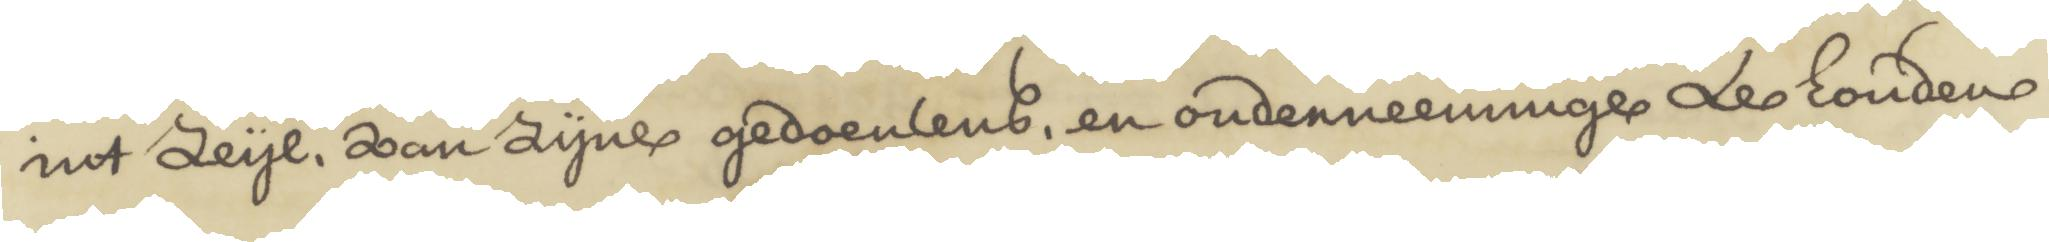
int zeijl, van zijne gedoentens, en onderneeminge te houden
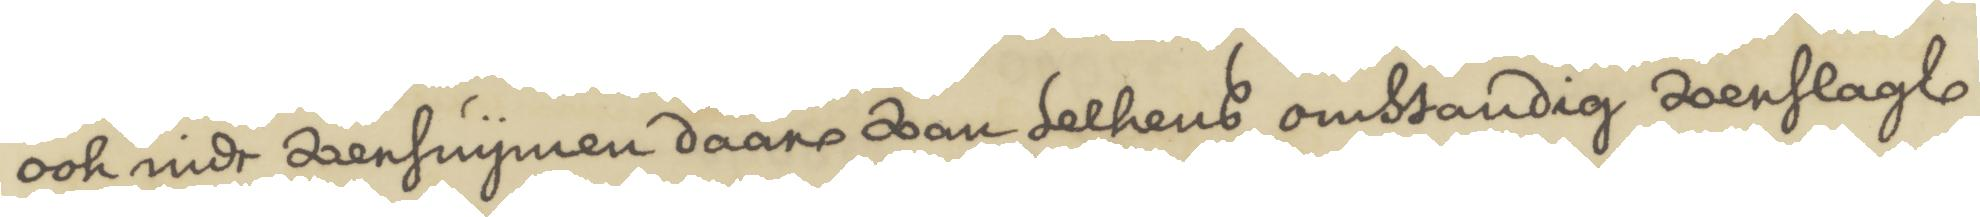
ook niet versuijmen daar van telkens omstandig verslagh
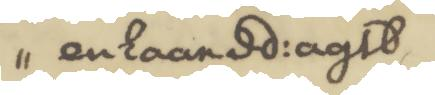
„ en haar ed: agtb
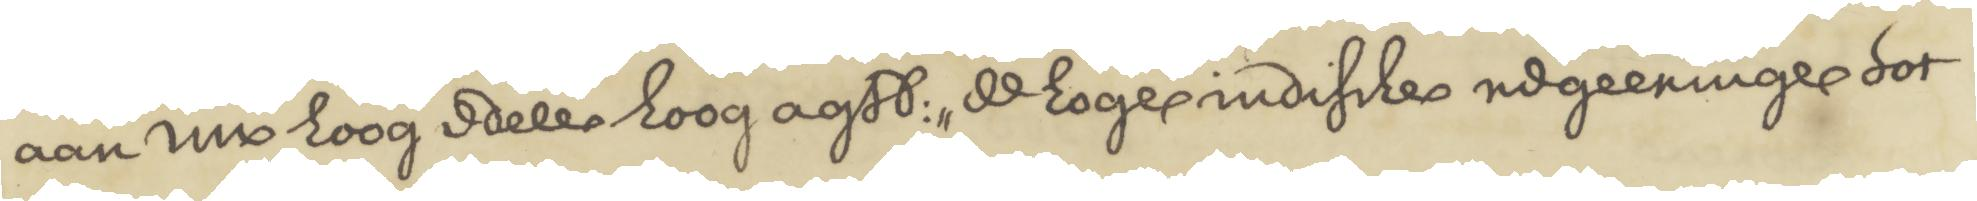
aan uw hoog edele hoog agtb: „ de hoge indische regeeringe tot
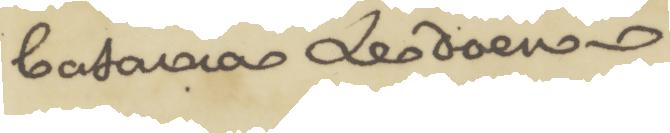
batavia te doen —
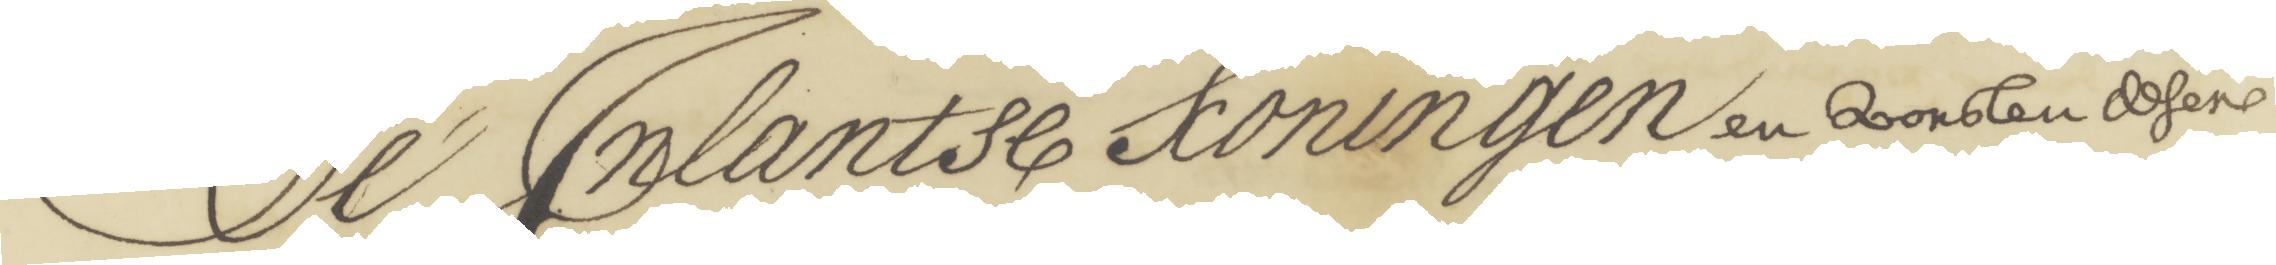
De Jnlantse koningen en vorsten deser
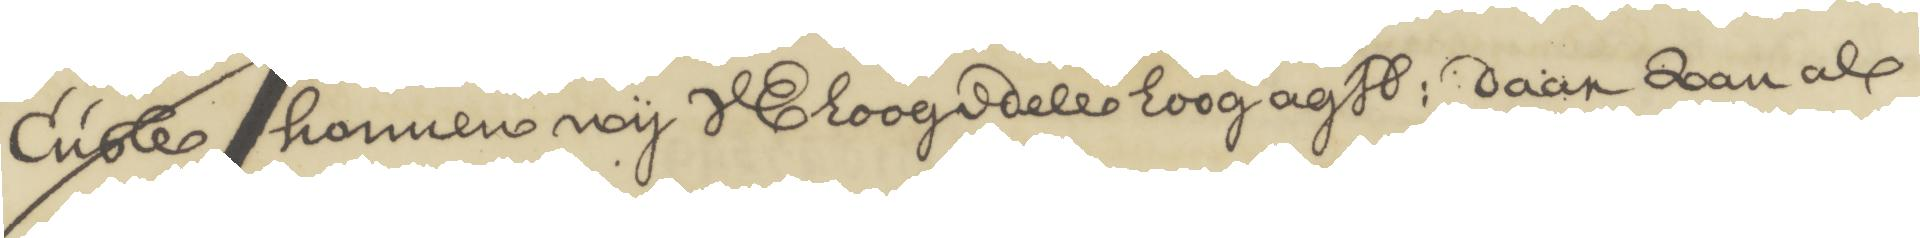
Custe konnen wij VE hoog edele hoog agtb: daar van al
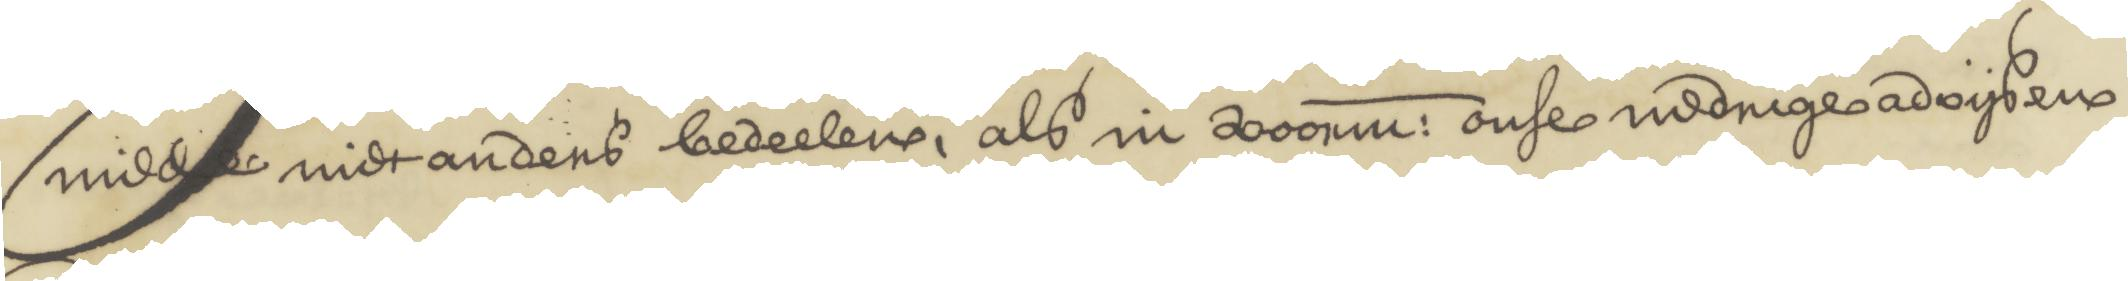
mede niet anders bedeelen, als in voorm: onse nedrige advijsen
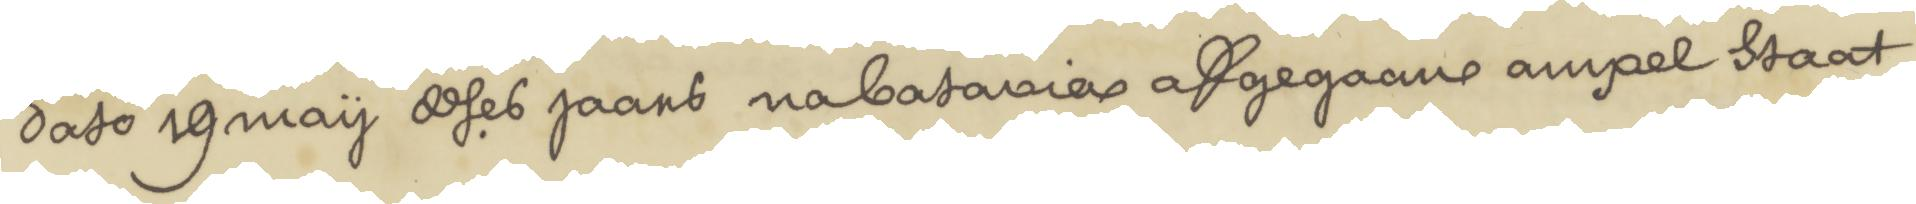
dato 19 maij deses jaars nabatavia afgegaan ampel staat
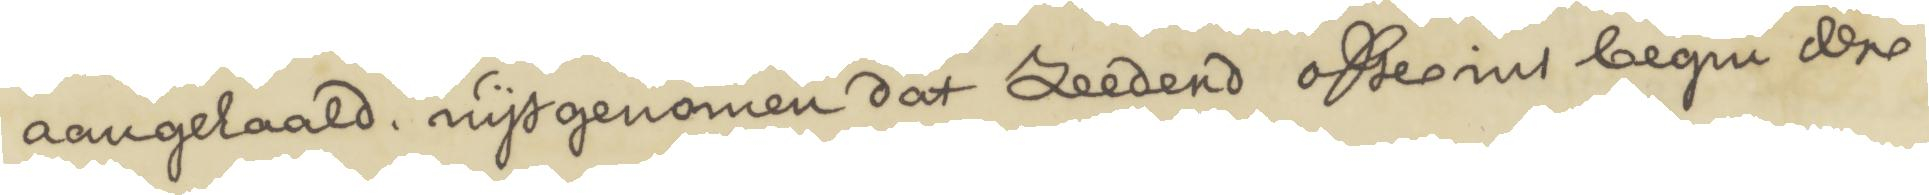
aangehaald, uijtgenomen dat zeederd ofte int begin der
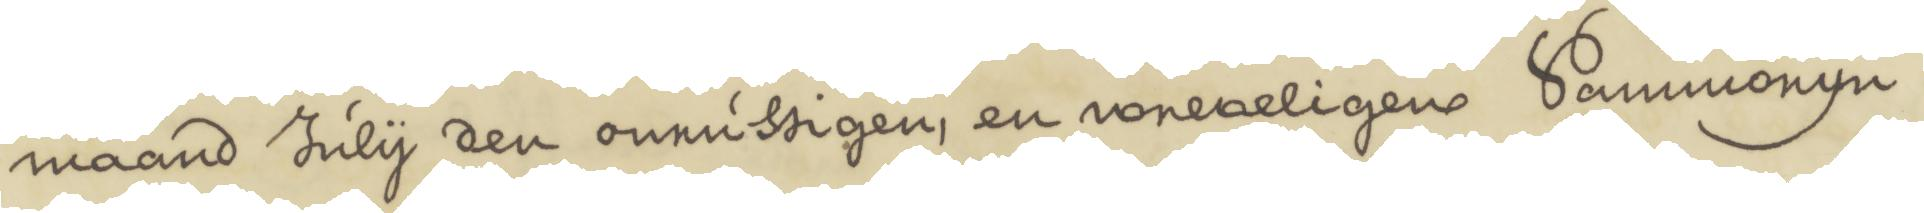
maand Iulij den onrustigen, en wreveligen Sammorijn
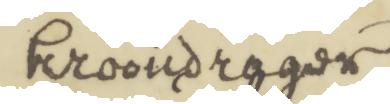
kroondrager
